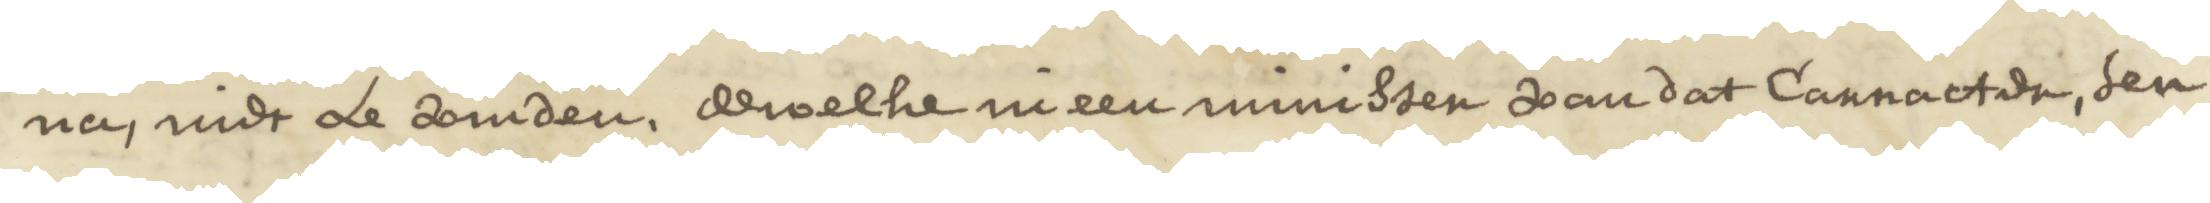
na, niet te vinden, dewelke in een minister van dat Carracter, ten
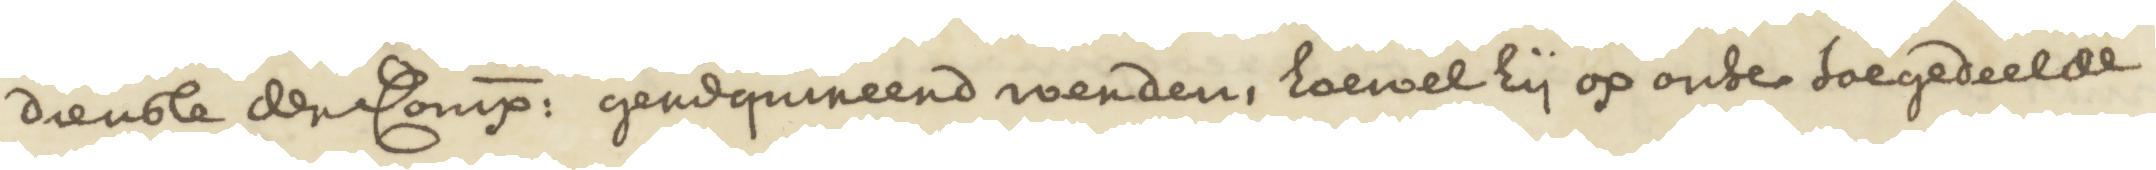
dienste der Comp: gerequireerd werden, hoewel hij op onse toegedeelde
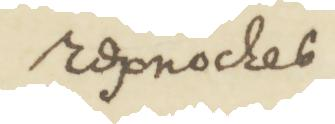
reproches
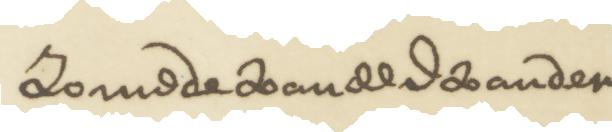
zo mede van de E vander
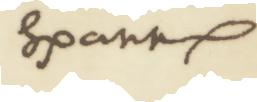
sparr
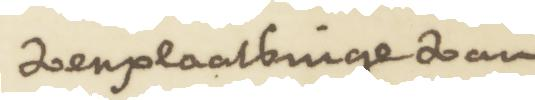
verplaatsinge van
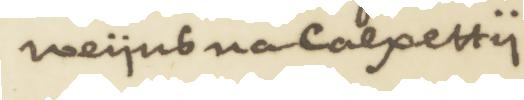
weijns na Calpettij
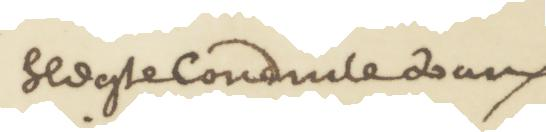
slegte conduite van
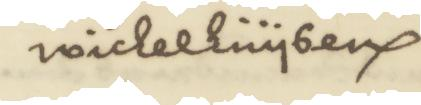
wichelhuijsen
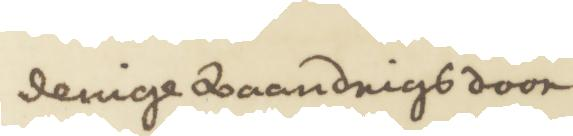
eenige vaandrigs door
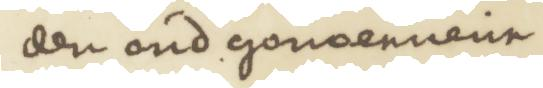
den oud gouverneur
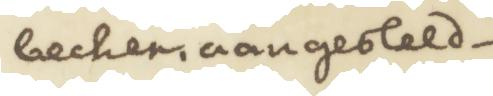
becker, aangesteld
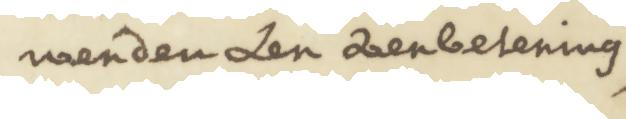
werden ter verbetering
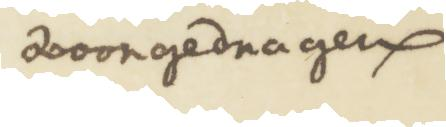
voorgedragen
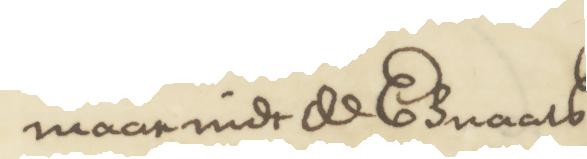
maar niet de E snaats
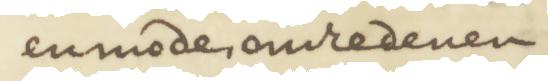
en mode, om redenen
